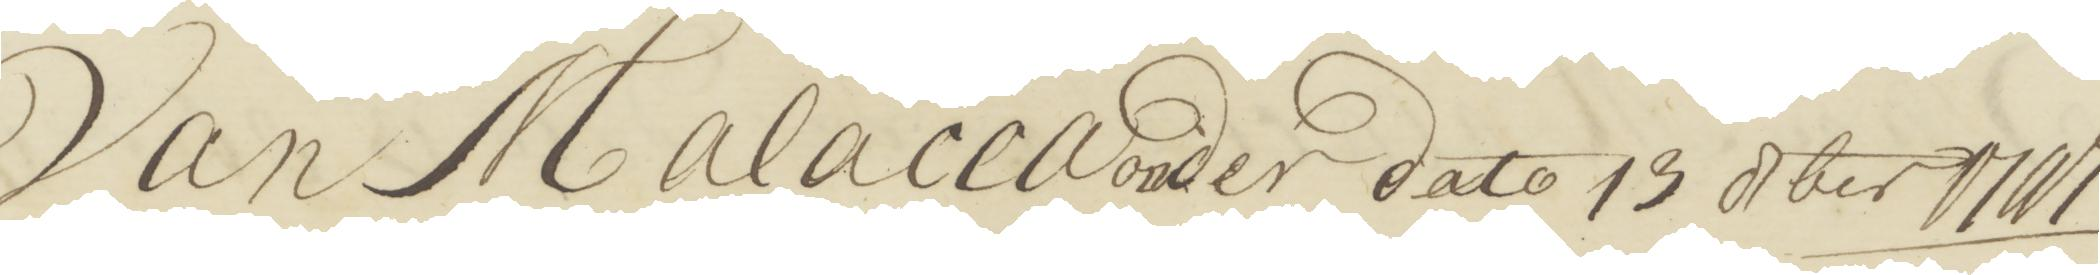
Van Malacca onder dato 13 8ber 1747
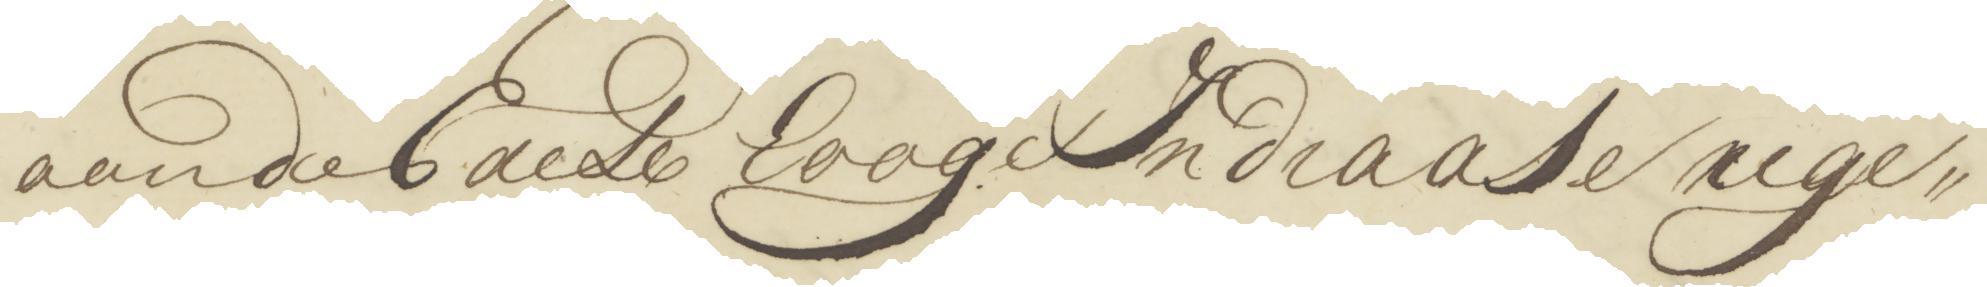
aan de Edele hoog Jndiaase rege„
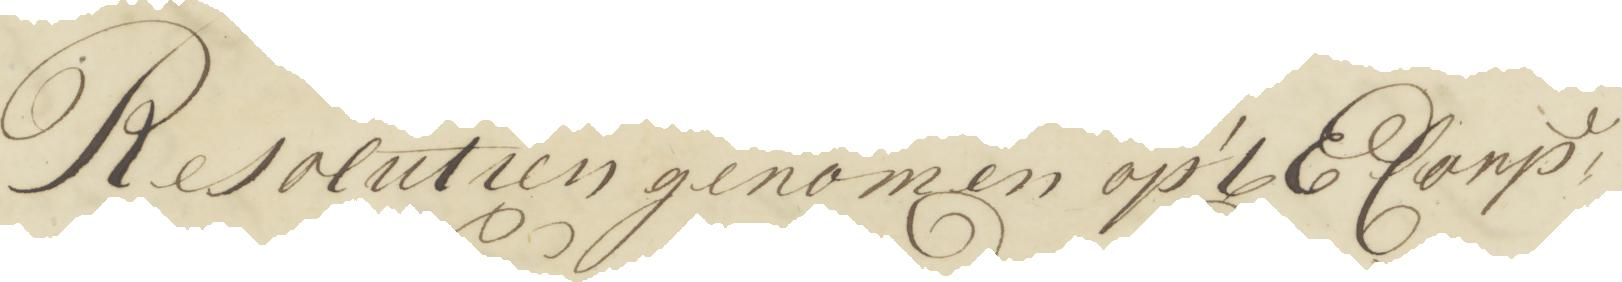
Resolutien genomen op ’t EComp„e
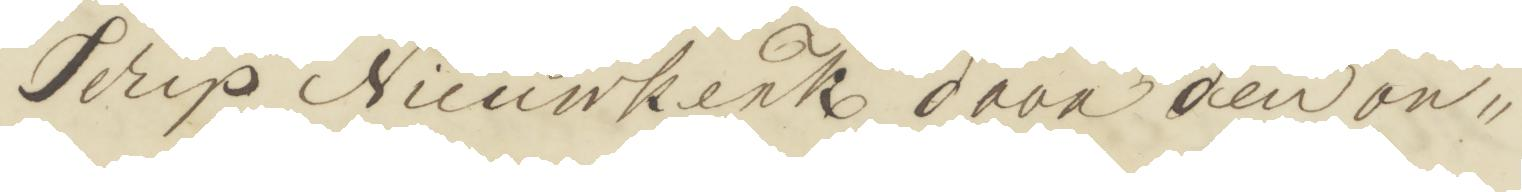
schip Nieuwkerk door den on„
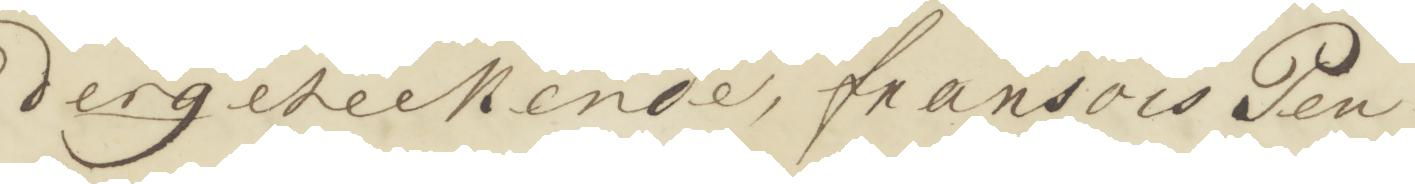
dergeteekende, fransois Pen
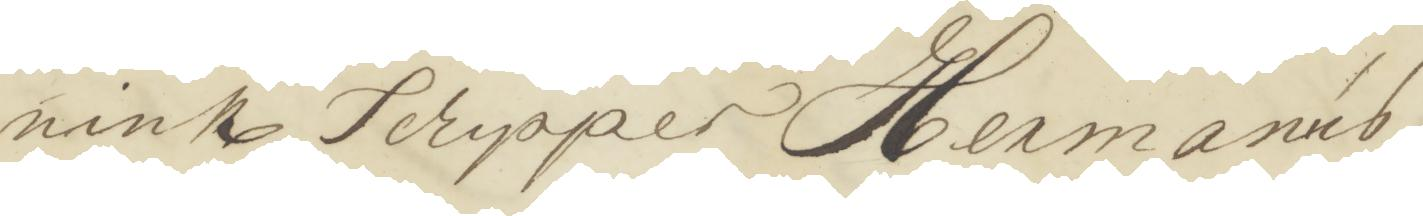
nink Schipper Hermanus
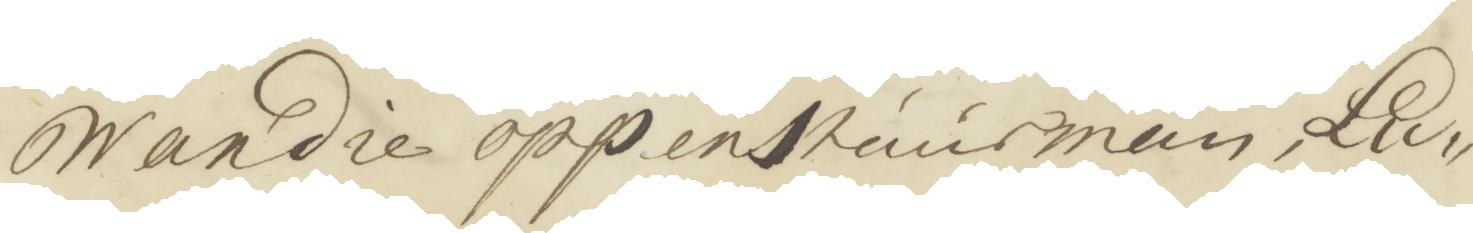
wardie opperstuurman, Lu„
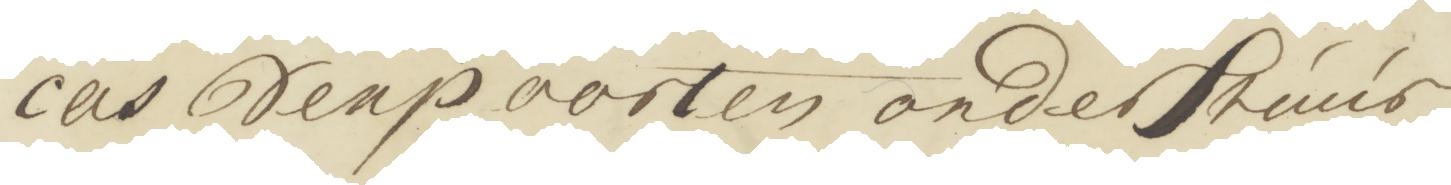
cas der poorten onderstuur
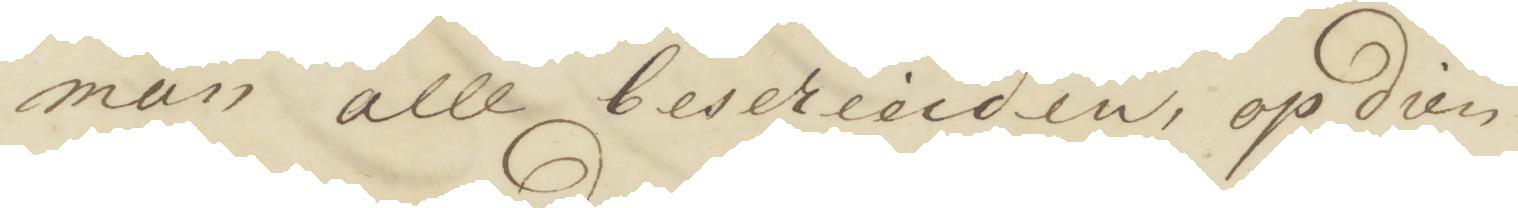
man alle bescheeiden, op dien
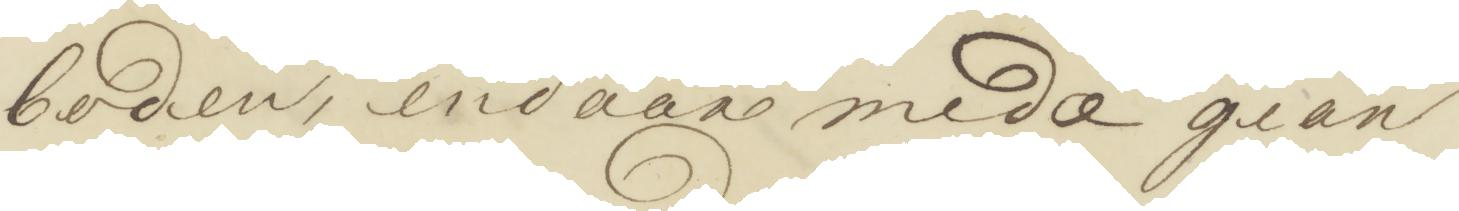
beden, en daar mede gean
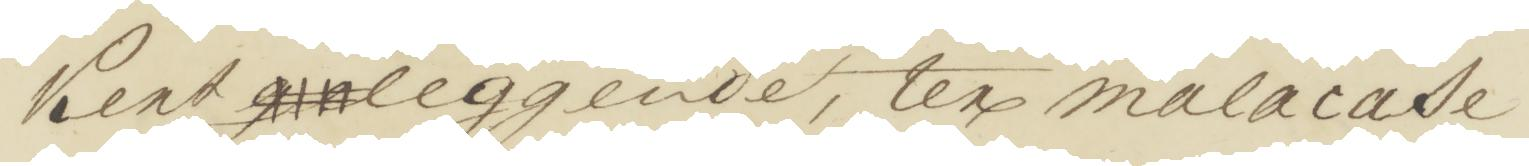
kert geleggende, ter malacase
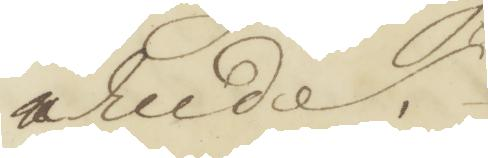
rheede,
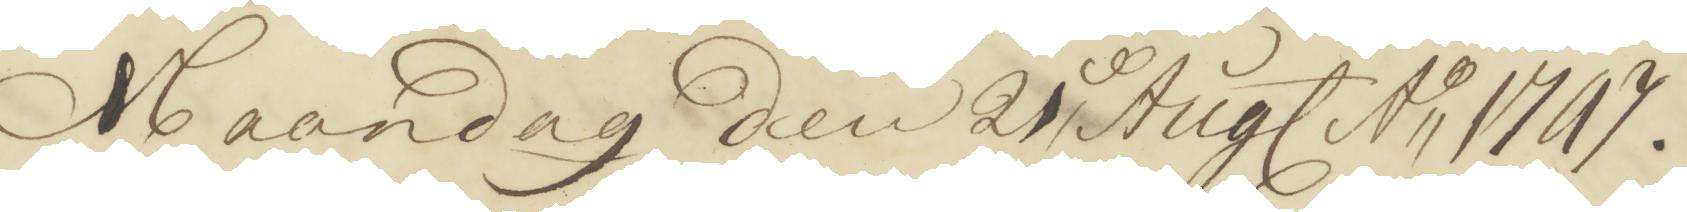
Maandag den 21,e Augc A„o 1747.
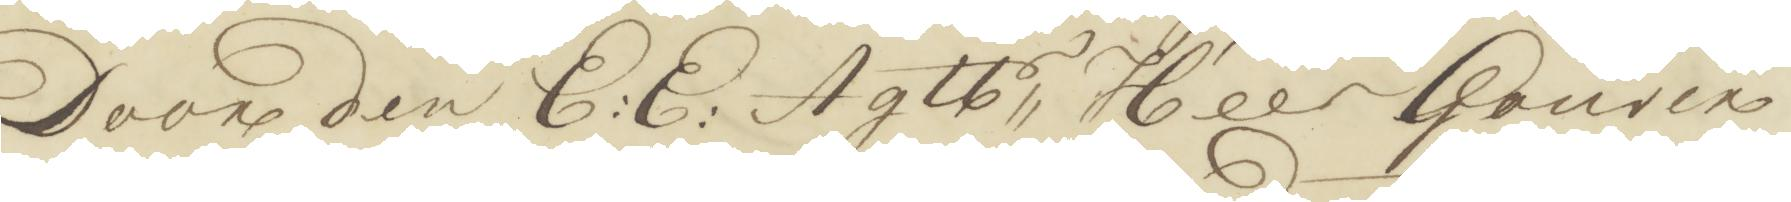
Door den E:E: Agtb„s Heer Gouver
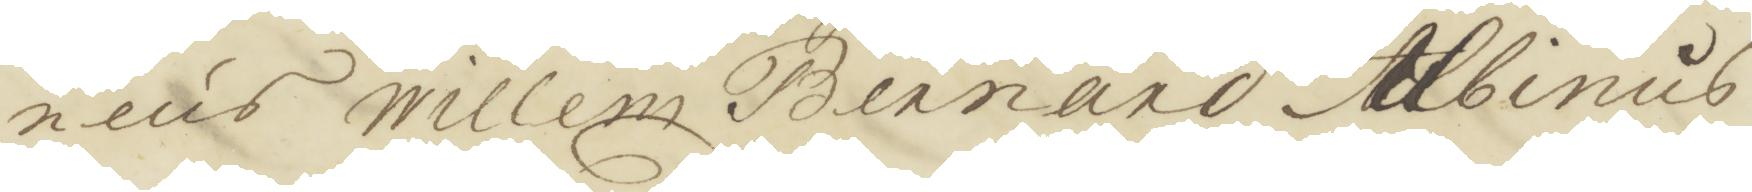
neur willem Bernard Albinus
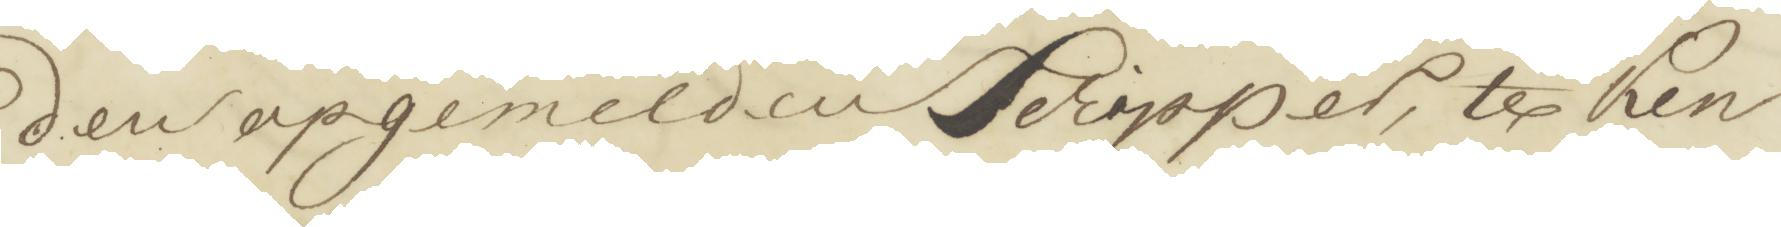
den opgemelden schipper, te ken
